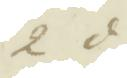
2 d
